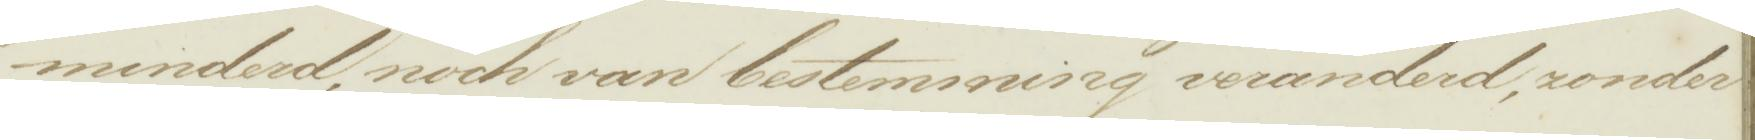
minderd, noch van bestemming veranderd, zonder
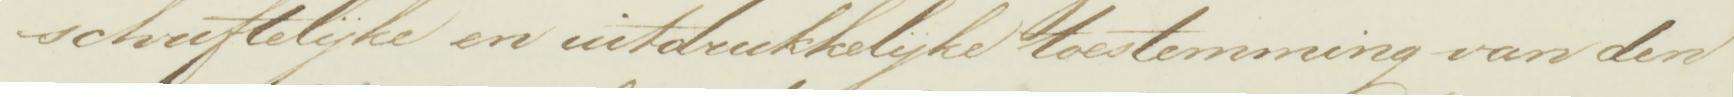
schriftelijke en uitdrukkelijke toestemming van den
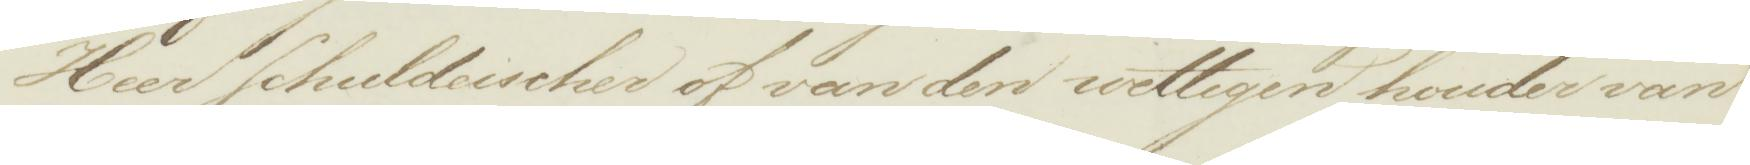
Heer schuldeischer of van den wettigen houder van
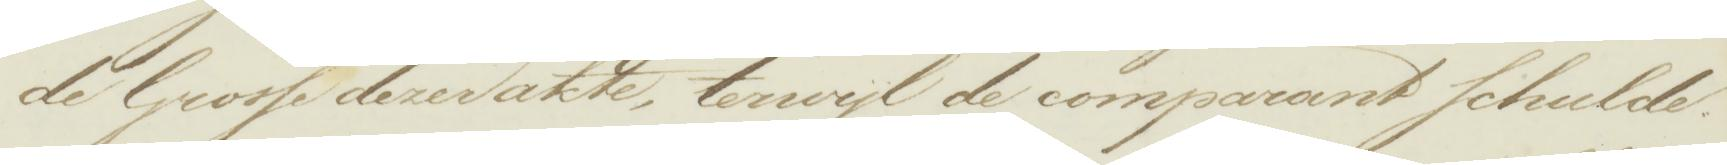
de Grosse dezer akte, terwijl de comparant Schulde.
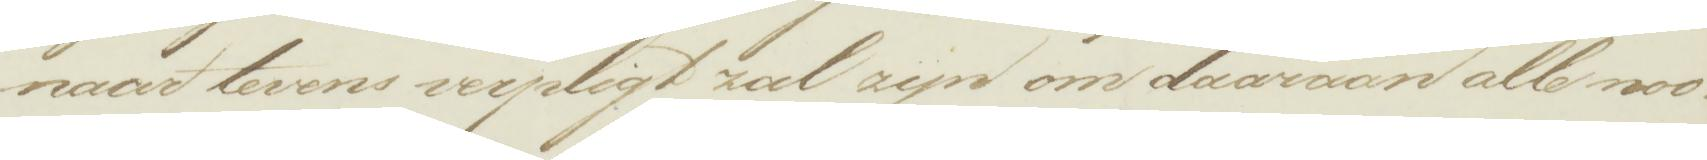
naar tevens verpligt zal zijn om daaraan alle noo„
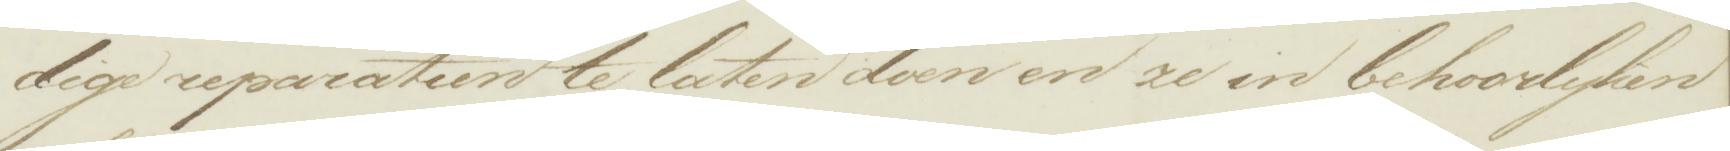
dige reparatien te laten doen en ze in behoorlyken
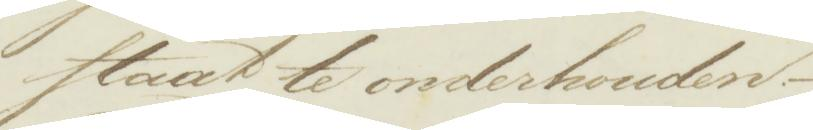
staat te onderhouden.
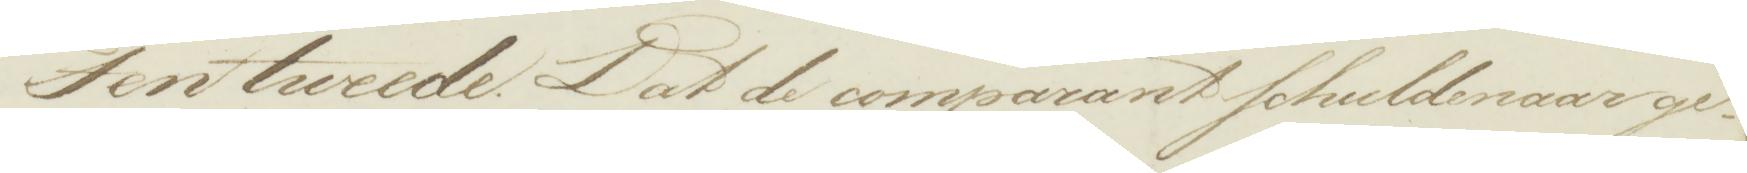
Ten tweede. Dat de comparant schuldenaar ge„
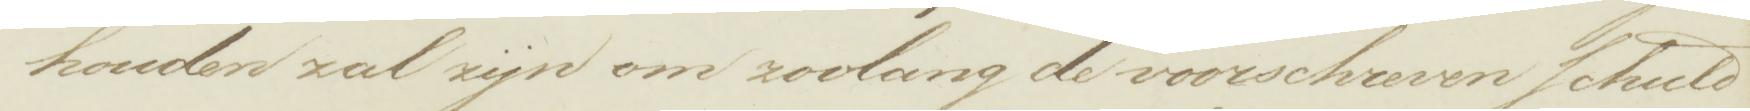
houden zal zijn om zoolang de voorschreven schuld
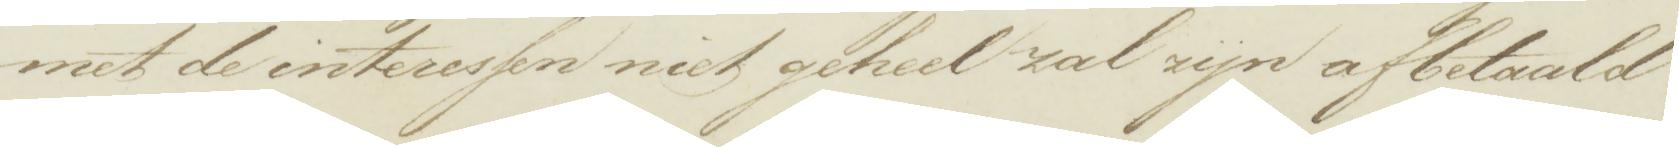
met de interessen niet geheel zal zijn afbetaald
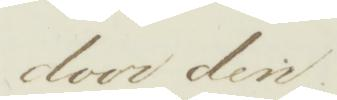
door den
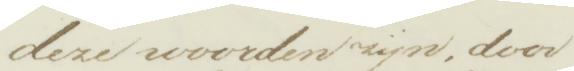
deze woorden zijn, door
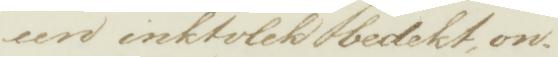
een inktvlek bedekt, on„
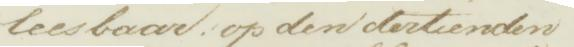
leesbaar, op den dertienden
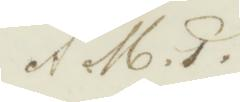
A: M. T.
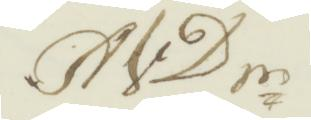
AvDjr:
